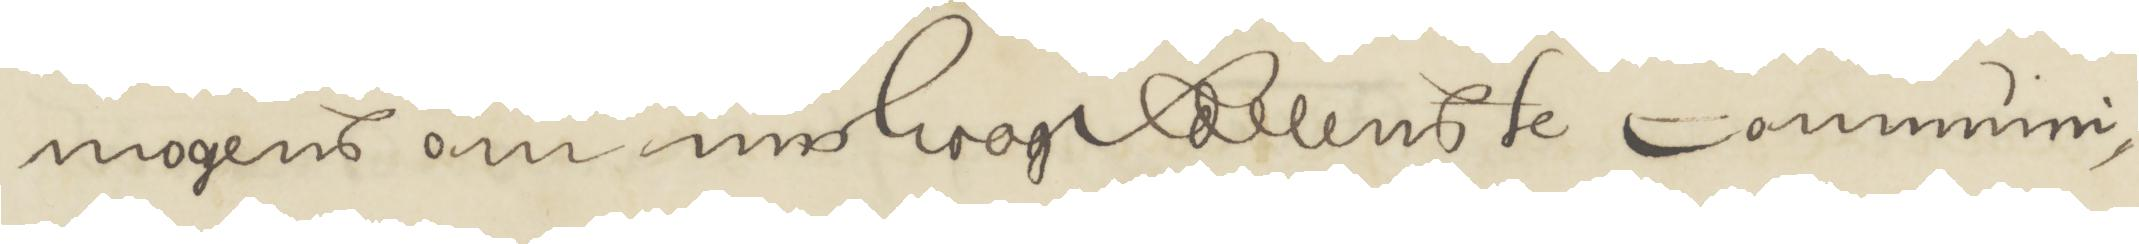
mogens om uw hoog Edelens te Communi„
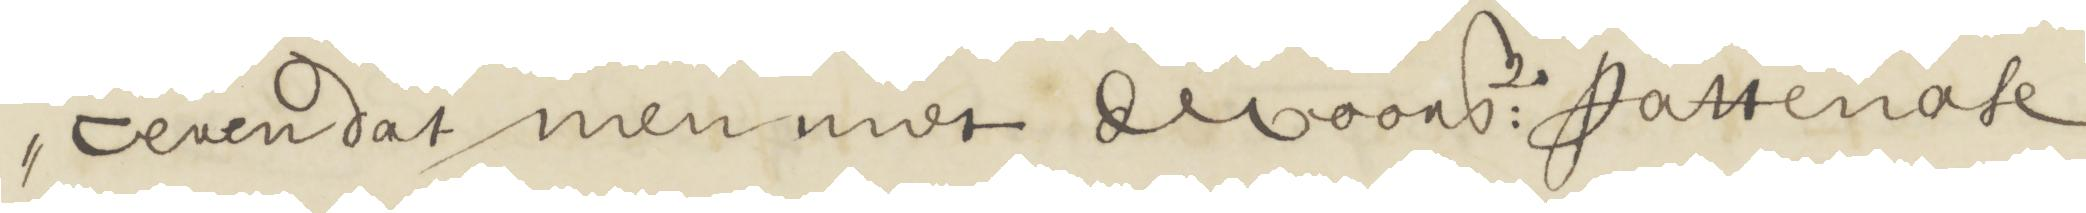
„ceren dat men met de voors: pattenase
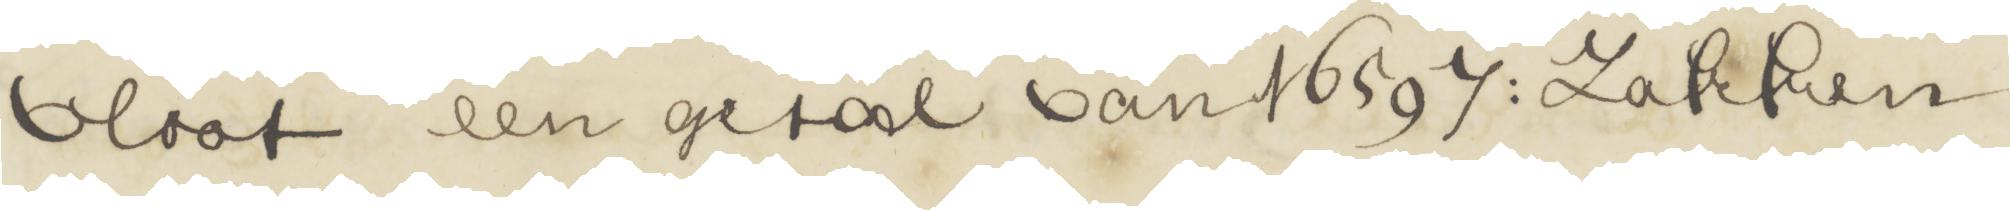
vloot een getal van 16597: zakken
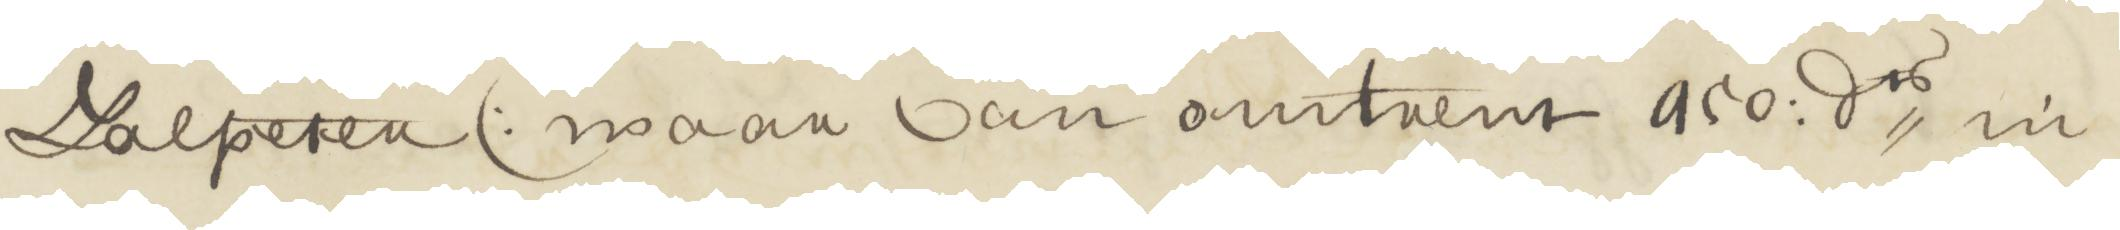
Zalpeter (: waar van omtrent 450: d„ts in
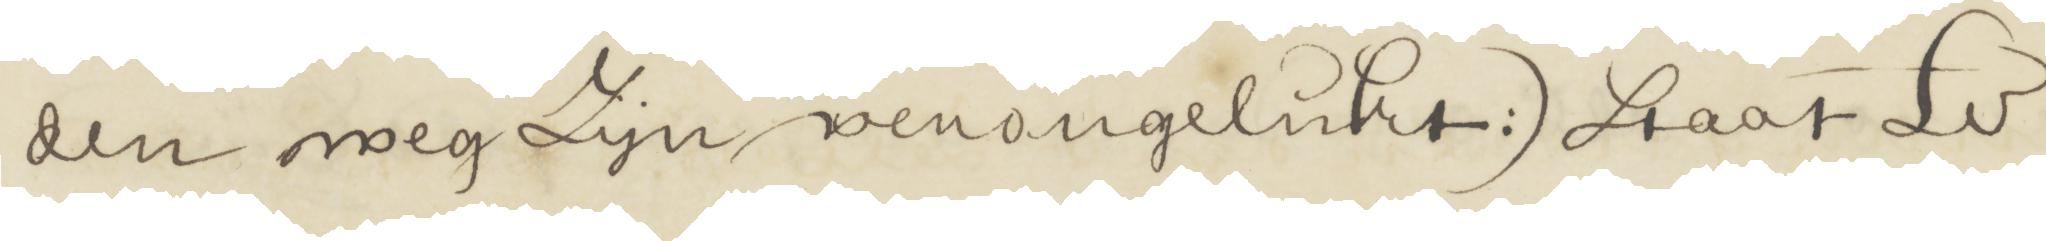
den weg zijn verongelukt :) staat te
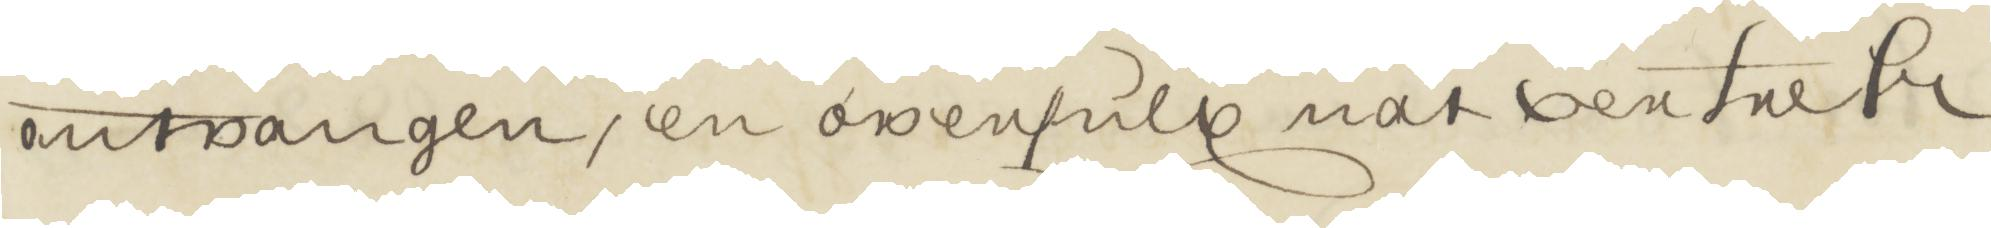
ontvangen, en oversulx na 't vertrek
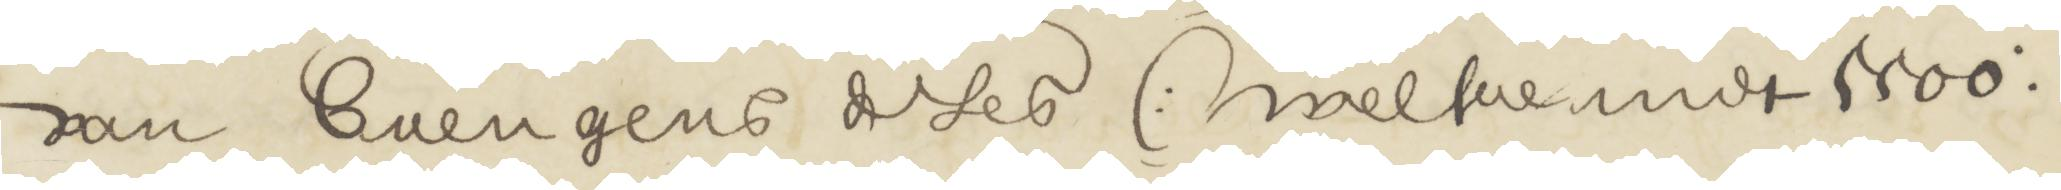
van brengers dezes (: welke met 5500:
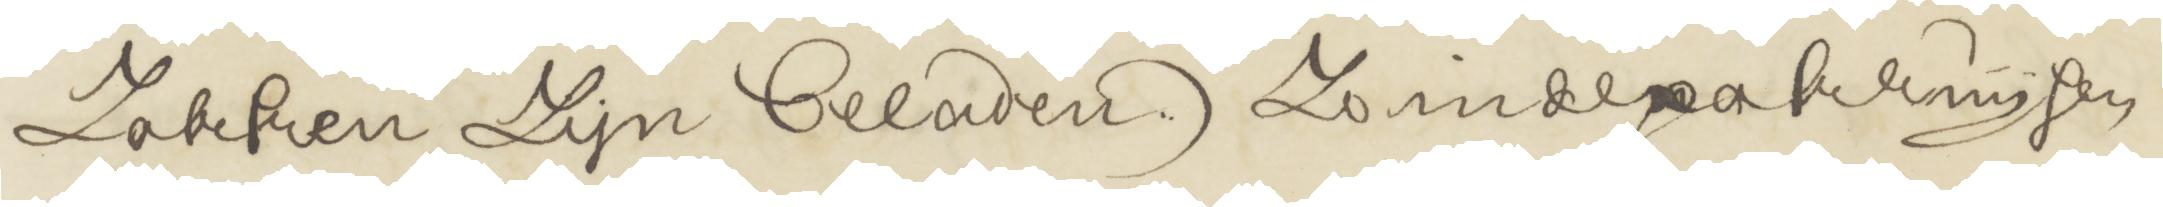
zakken zijn beladen :) zo in de pakhuijsen
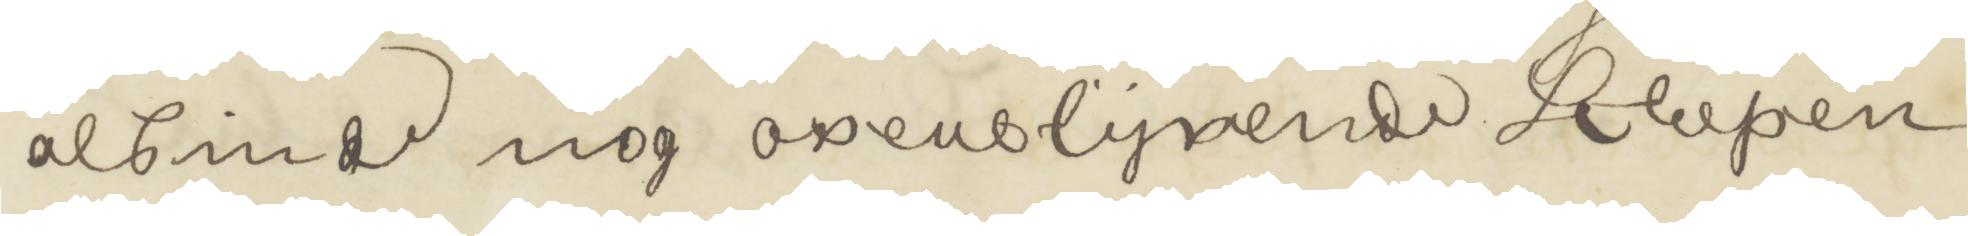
als in de nog overblijvende schepen
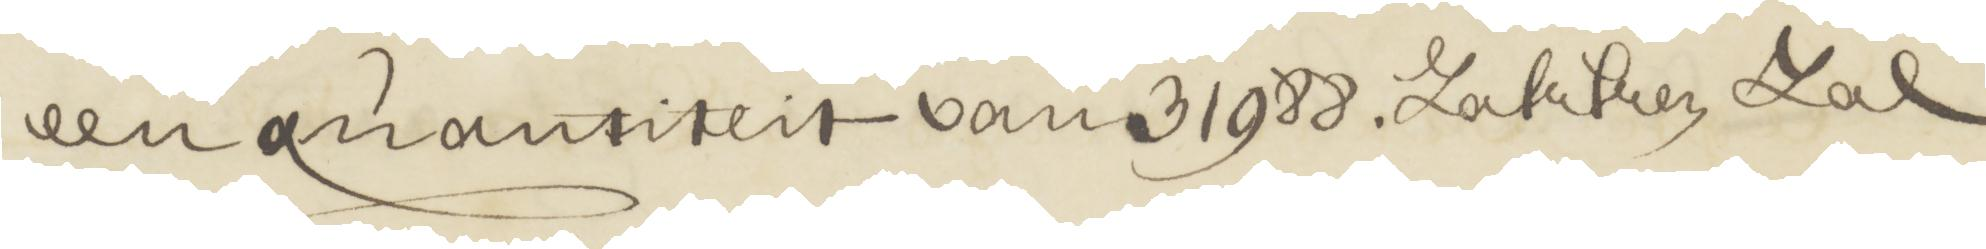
een quantiteit van 31988. zakken zal
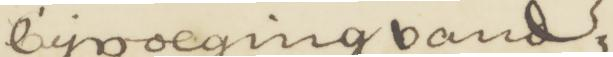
bijvoeging vande,
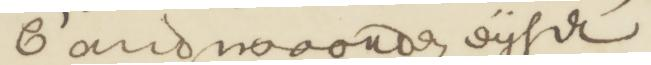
b'andwoorden eijsch
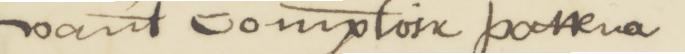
van 't Comptoir pattna
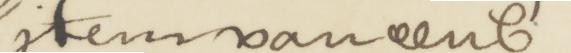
jtem van een b'
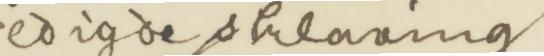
edigde verklaring
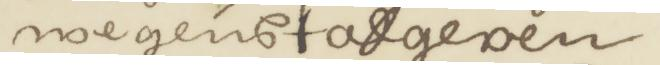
wegens 't afgeven
